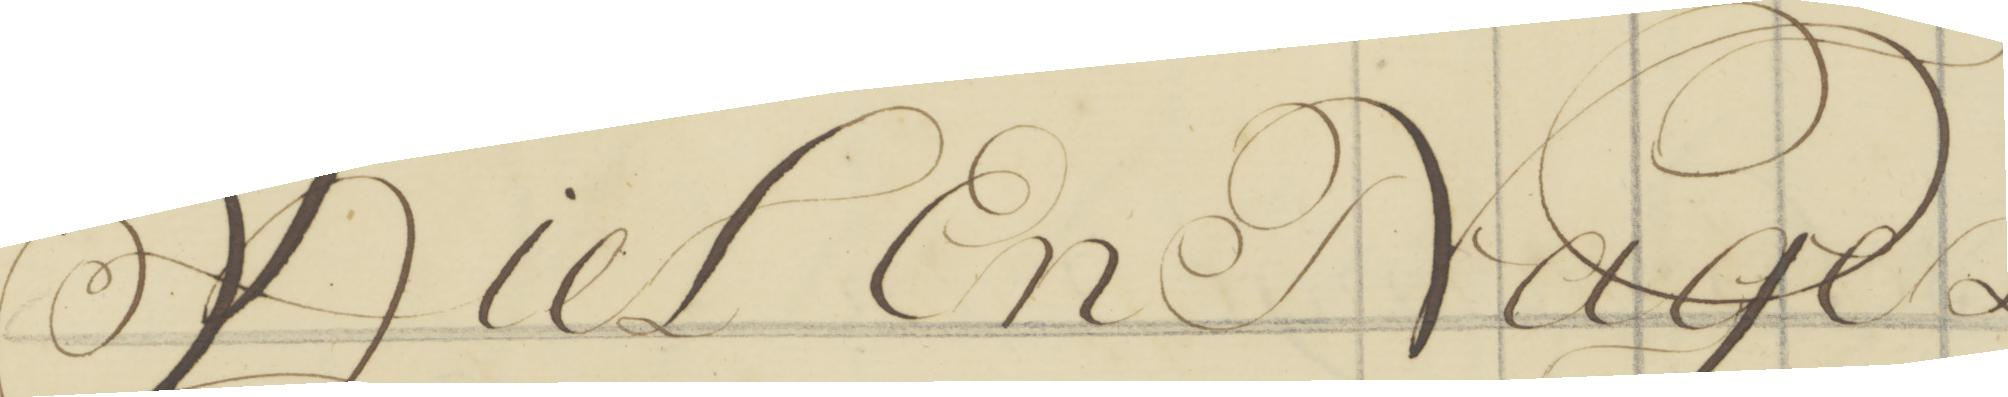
Ziel En Nagel
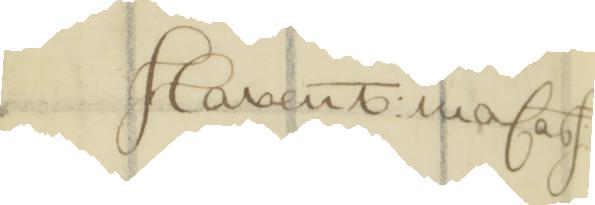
Slaven v: macass
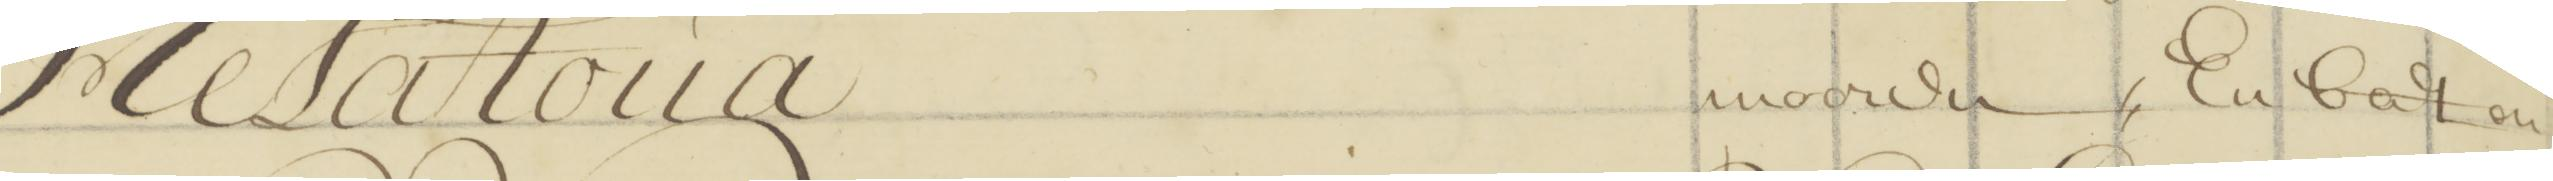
Melatoua mooren „ En boeton
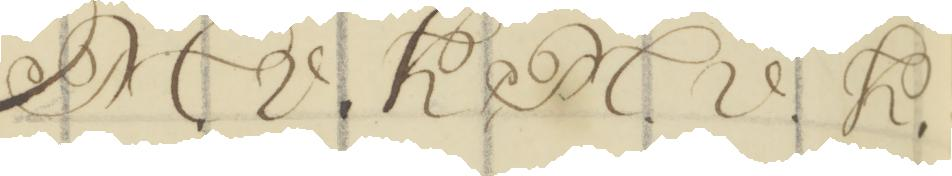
M. V. K. „ M. V. K.
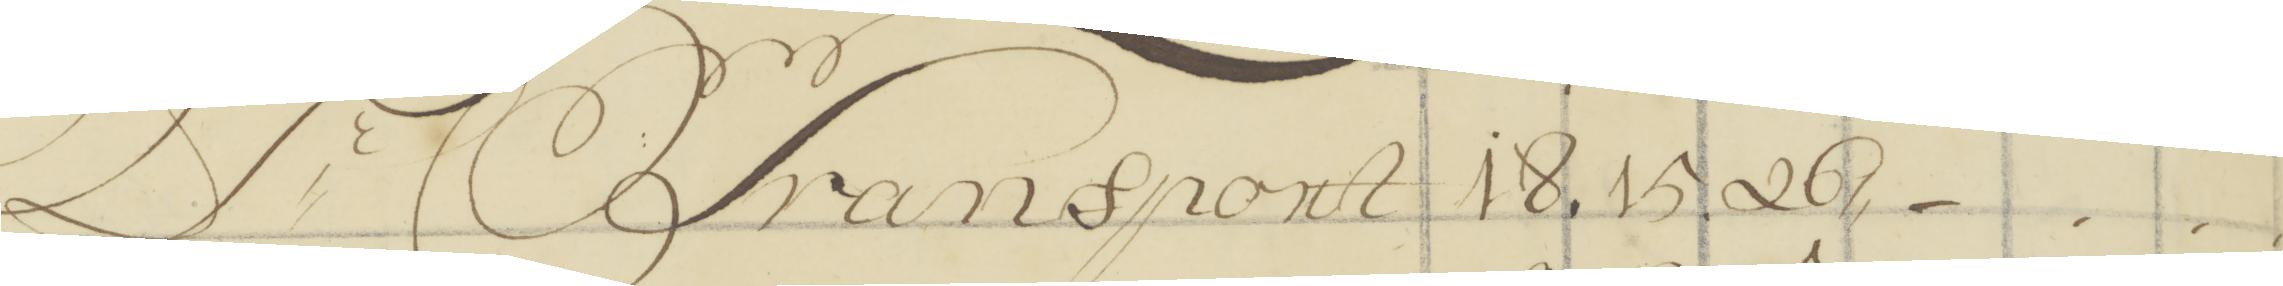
P„r Transport 18.15. 26„ — – –
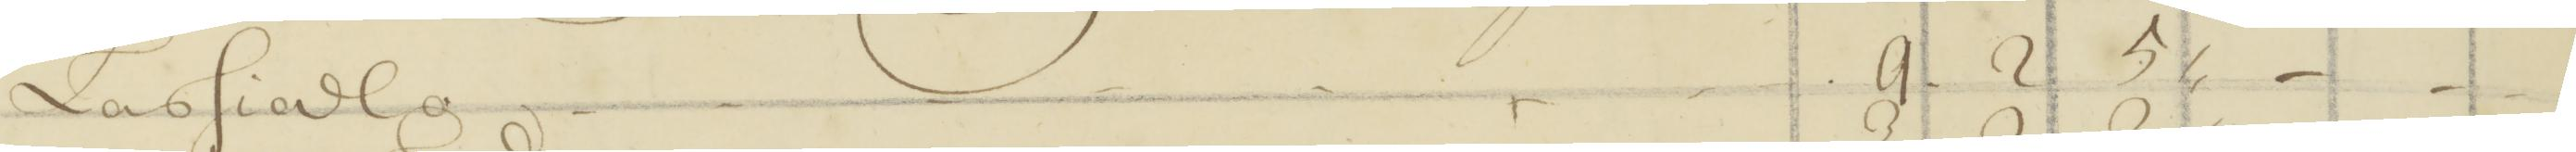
Lassioelo – – – – – – – – . 9. 2 5 „ — —
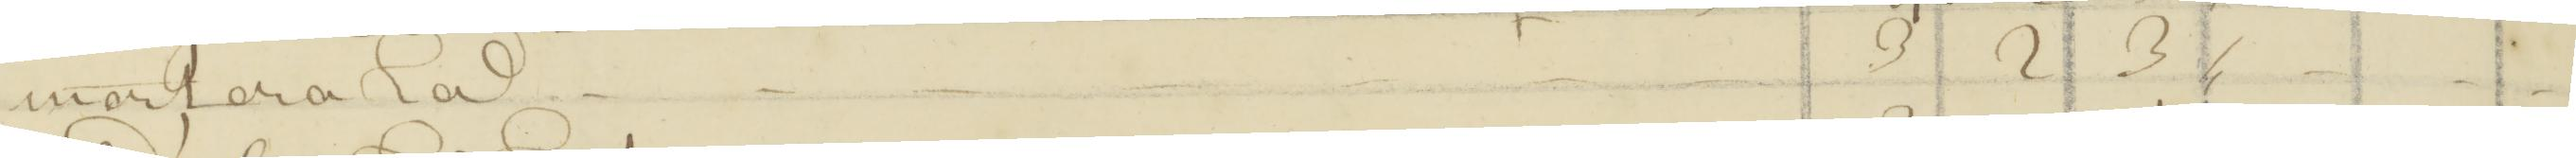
martera hae – – – – – – – 3 2 3 „ - - -
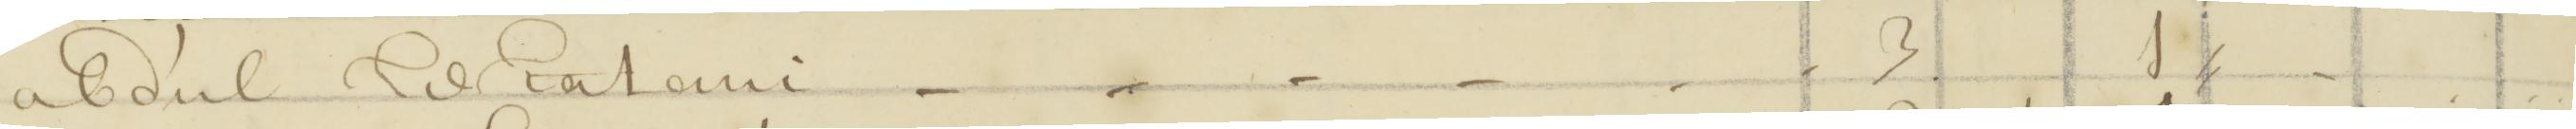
abdul heEcatani – – – – – - 3. 1 „ - , ,
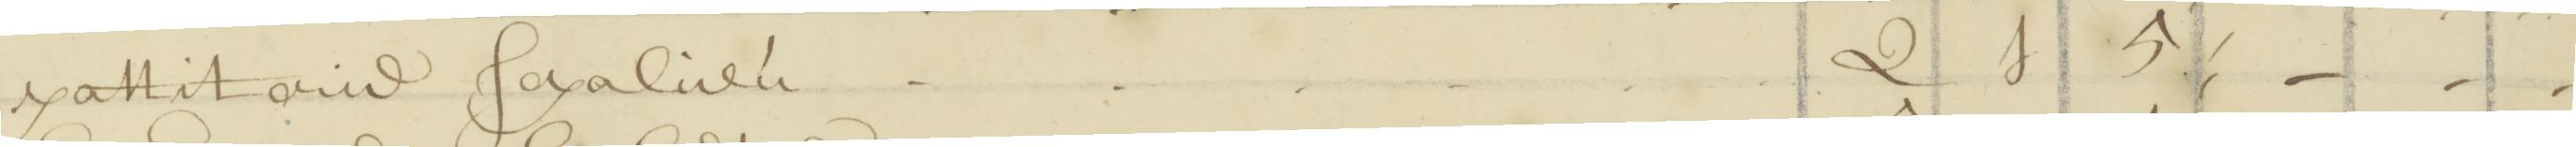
pattitaire sapalieu - . . - . . 2 1 5 „ — — —
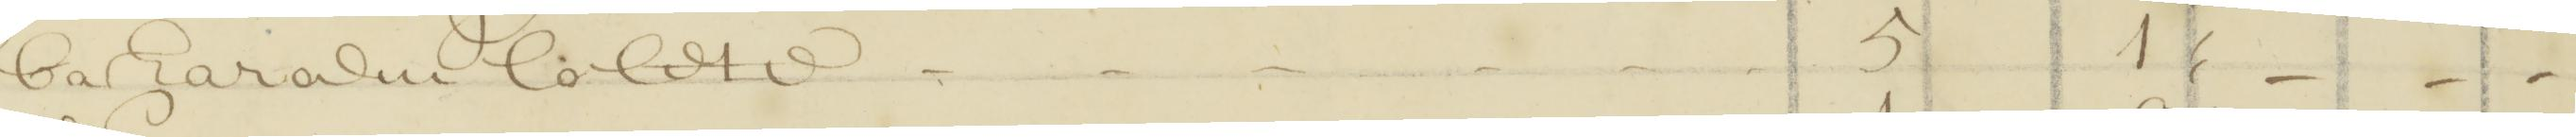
bacharoem lolete – – – – – . 5 1 „ — — —
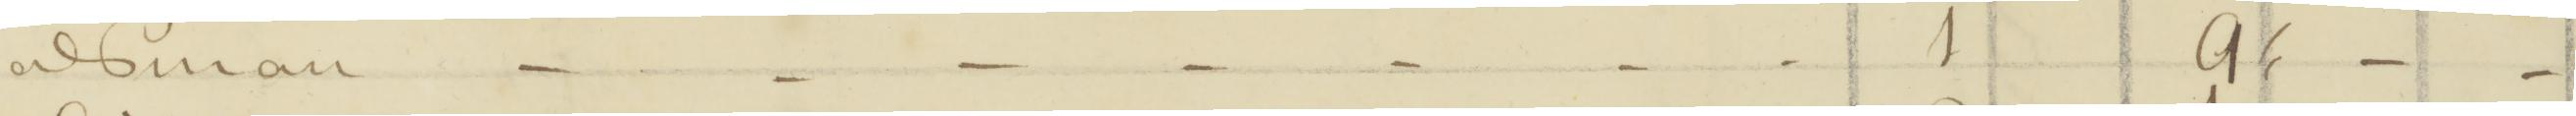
oesman – – – – – – - 1 9 „ — —
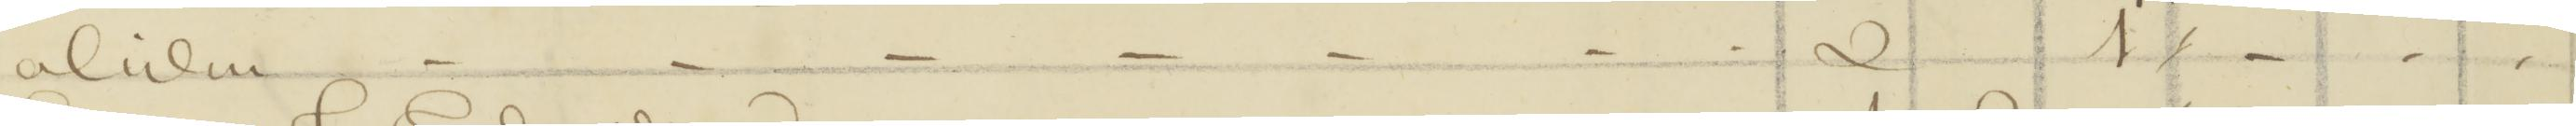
aliem – – – – – – - 2 1 „ — — —
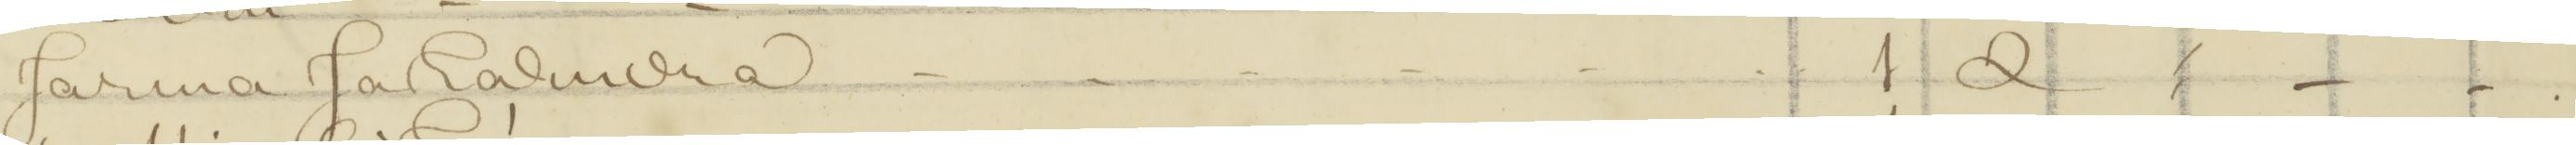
sarma sachaemera - - - - - - 1 2 „ — -
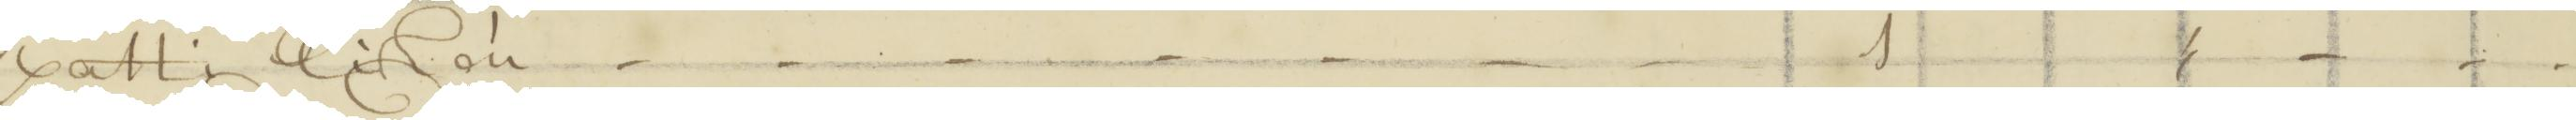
patti lichou – – – – – – – 1 „ – –
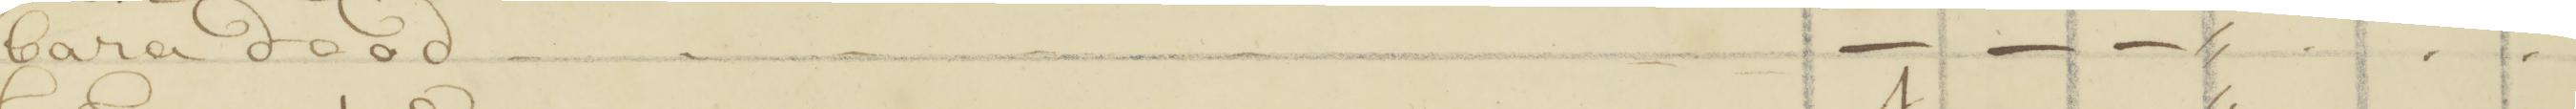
bara dood - - - - - - — — — „ - - -
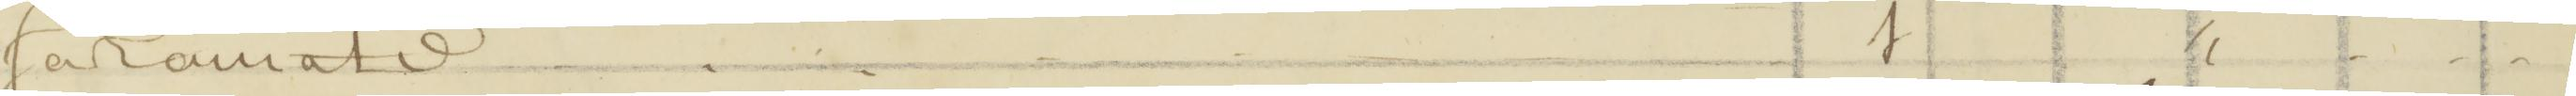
sachamate . . . - 1 „ - - -
